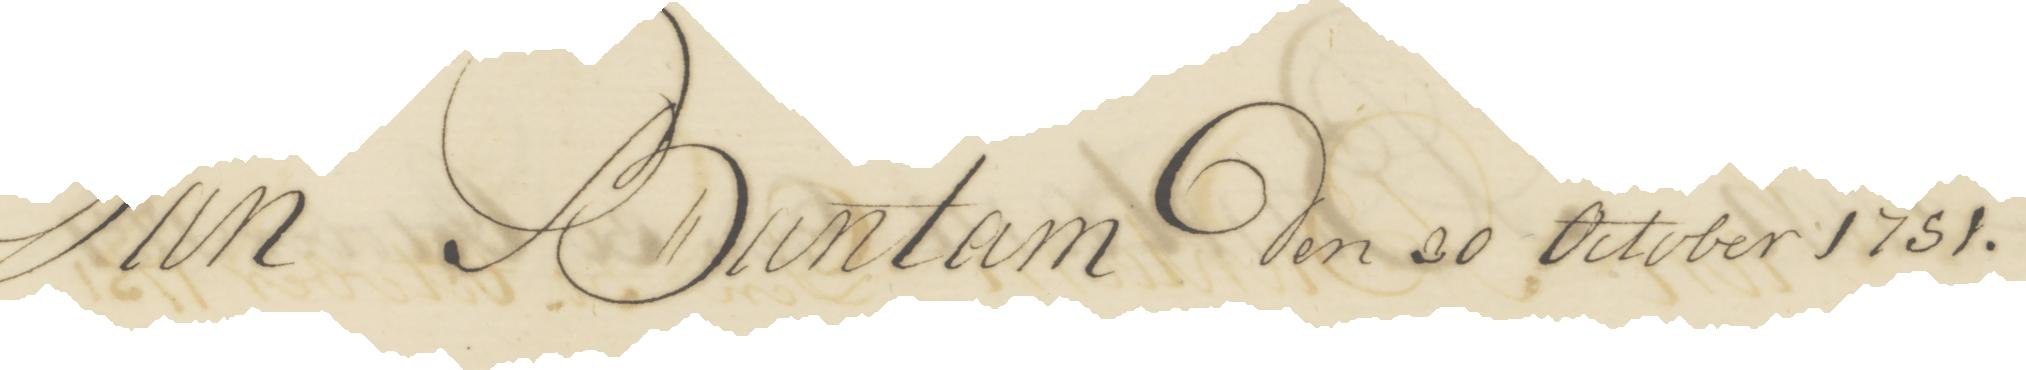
Van Bantam den 30 October 1751.
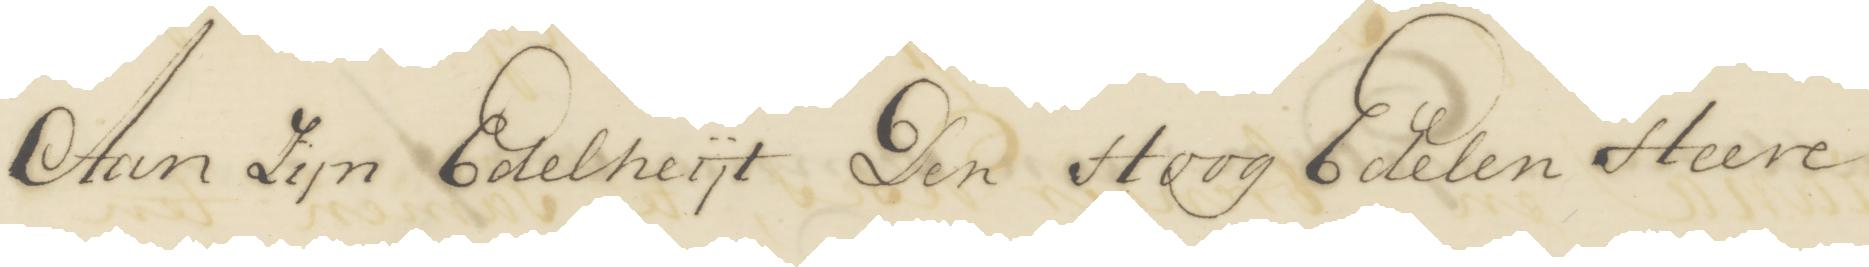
Aan zijn Edelheijt Den Hoog Edelen Heere
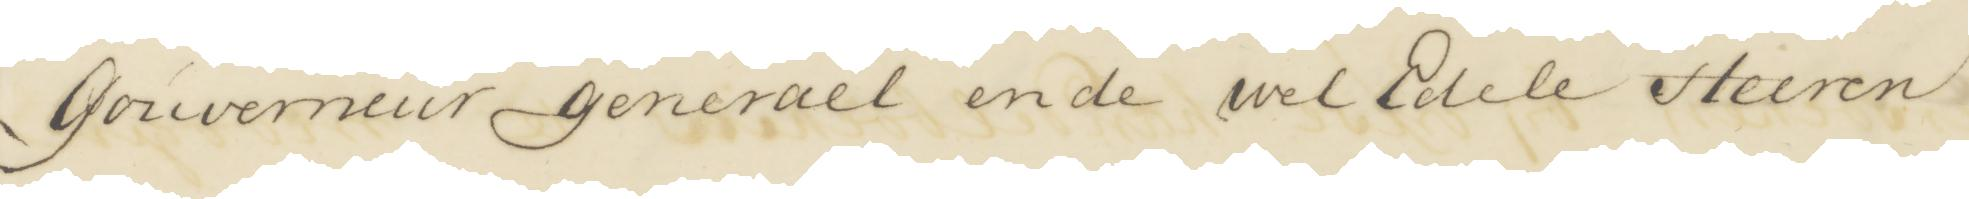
Gouverneur generael ende wel Edele Heeren
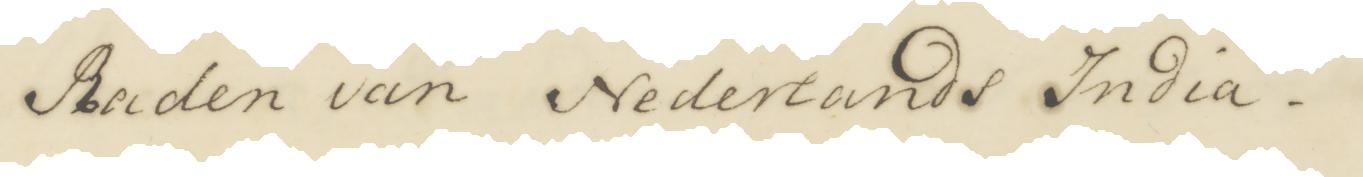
Raden van Nederlands Jndia.
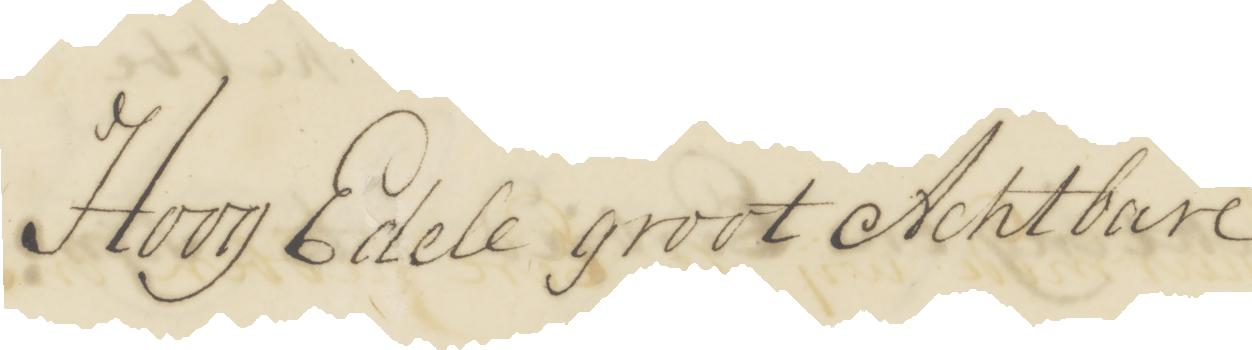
Hoog Edele groot Achtbare
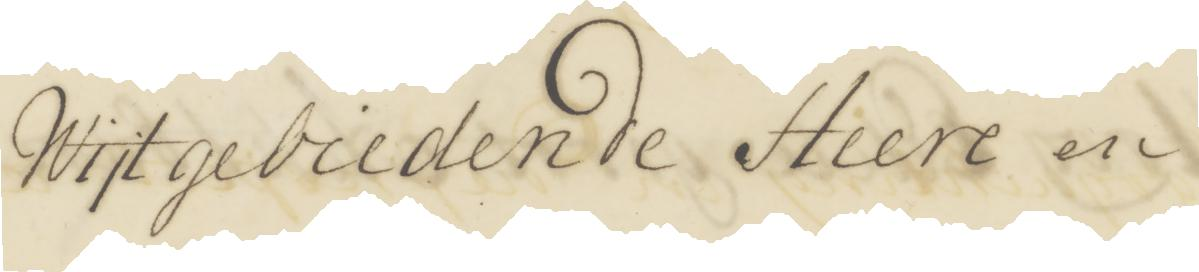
wijtgebiedende Heere en
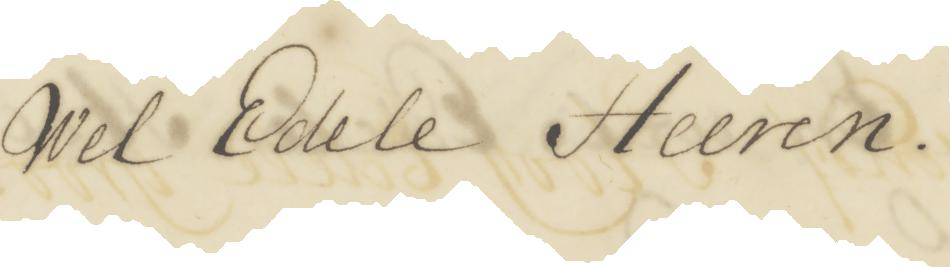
wel Edele Heeren.
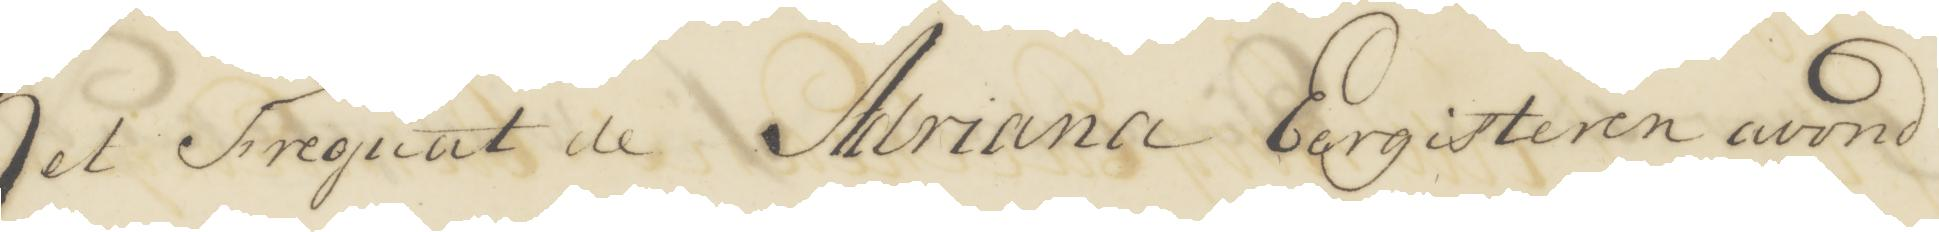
Het Freguat de Adriana Eergisteren avond
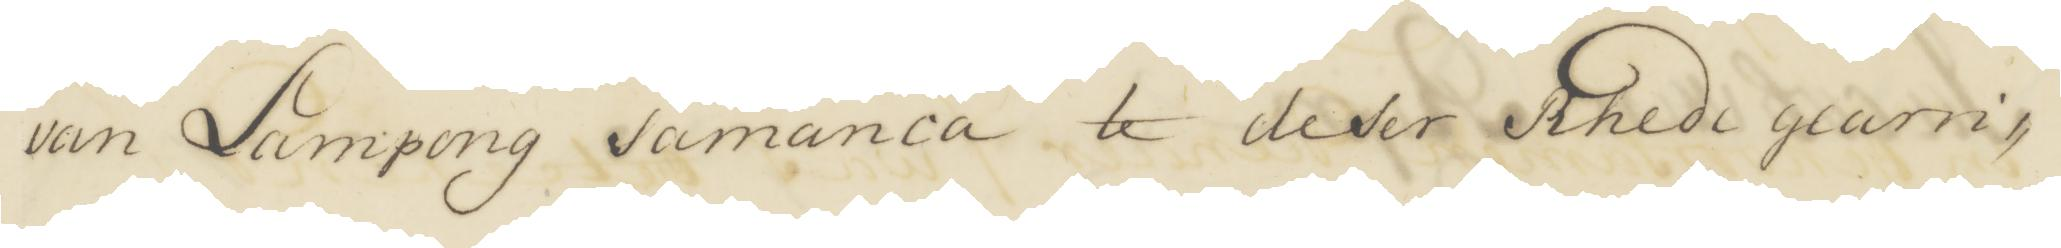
van Lampong samanca te deser Rhede gearri
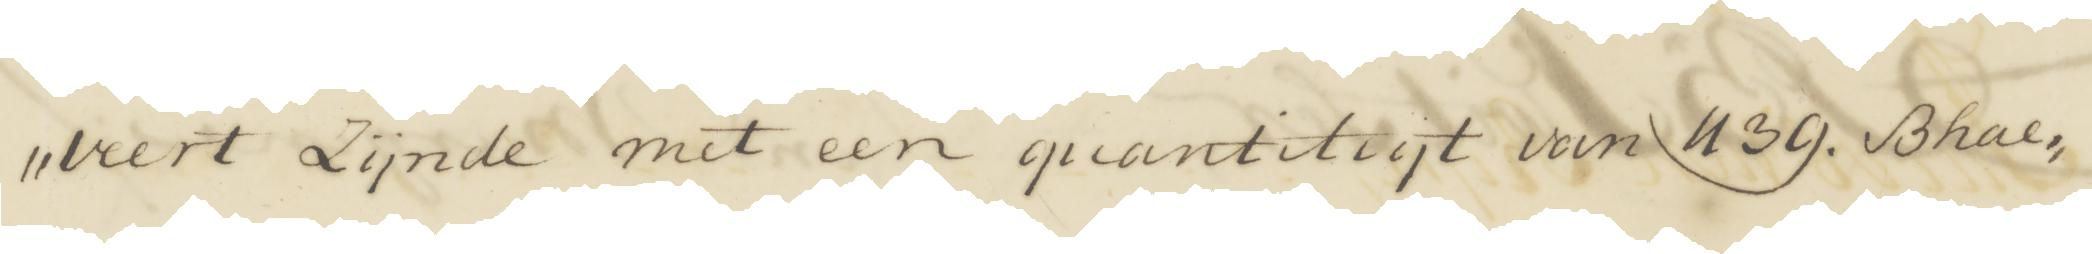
„veert zijnde met een quantiteijt van 439. Bhae„
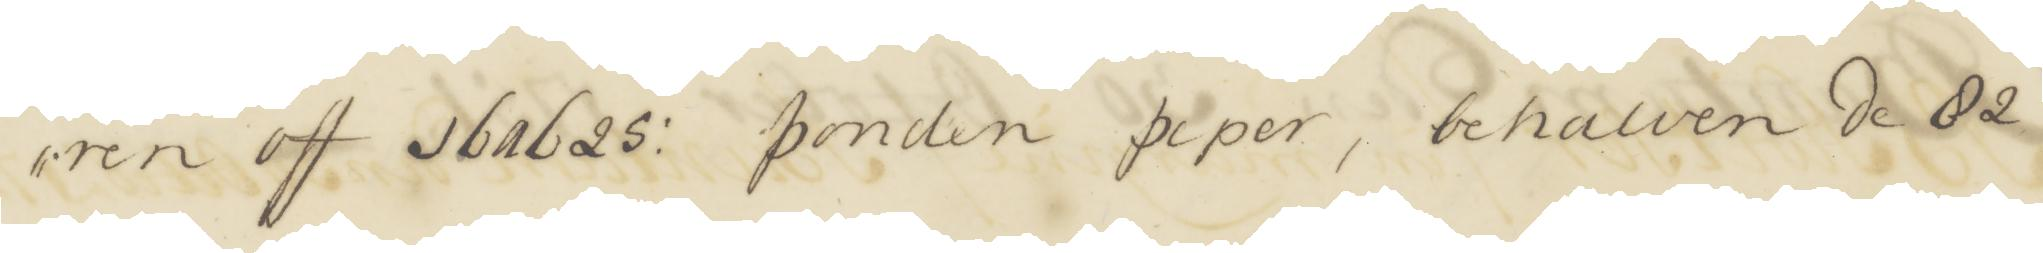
„ren off 164625: ponden peper, behalven de 82
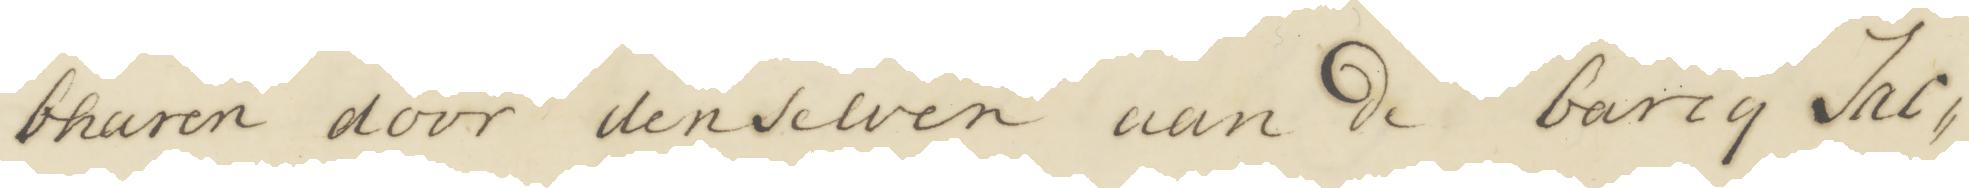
bharen door denselven aan de barcq Jac„
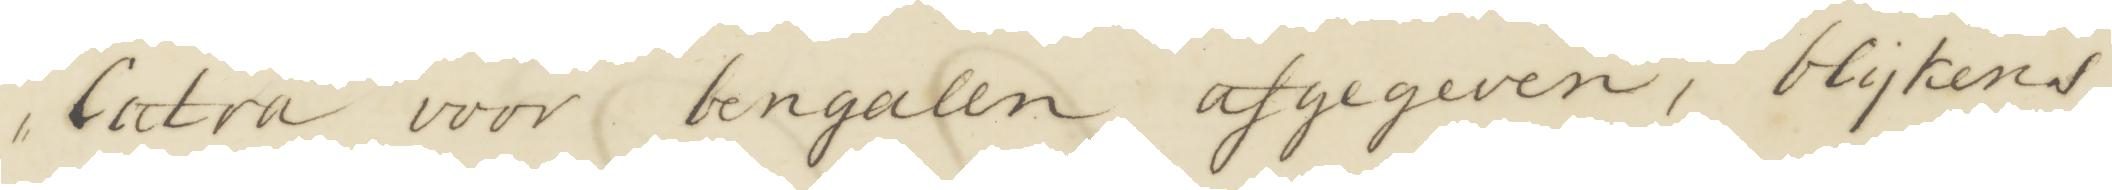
„catra voor bengalen afgegeven, blijkens
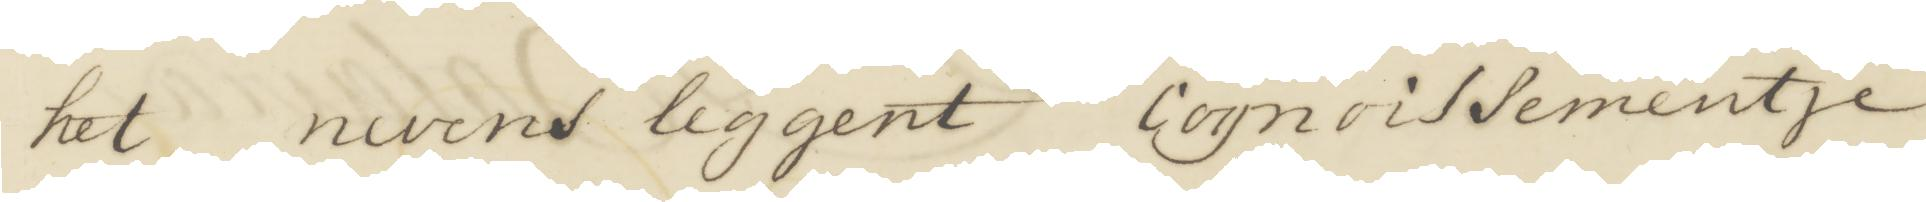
het nevens leggent cognoissementje
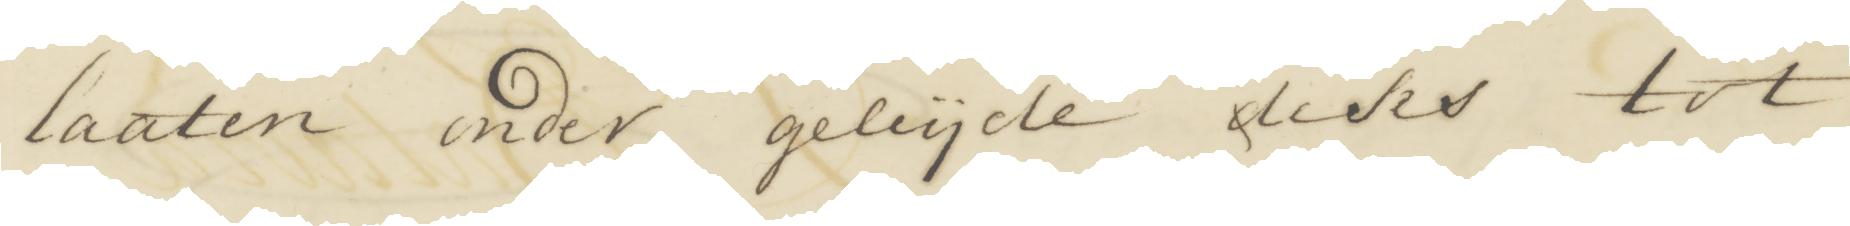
laaten onder geleijde deses tot
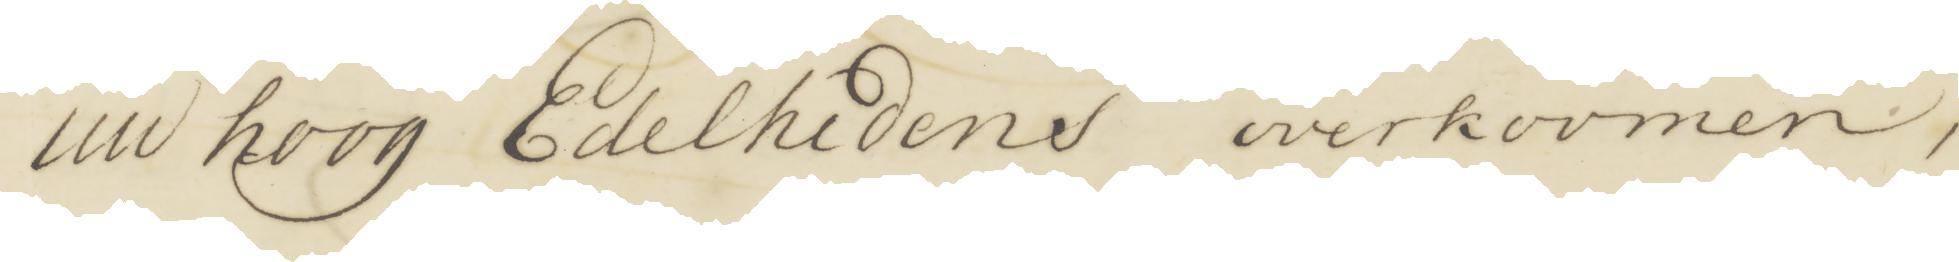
uw hoog Edelhedens overkoomen,
